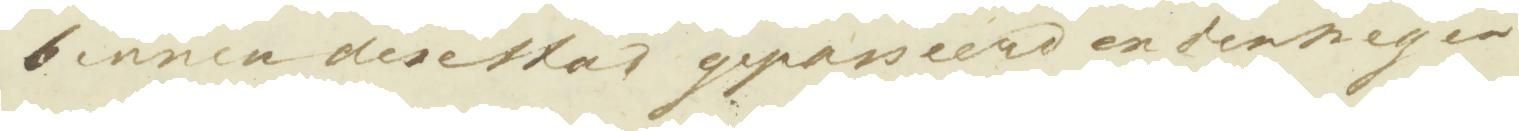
binnen dese stad gepasseerd en den negen
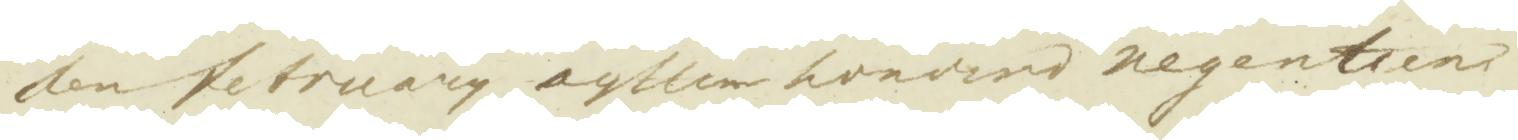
den february agtien honderd negentien,
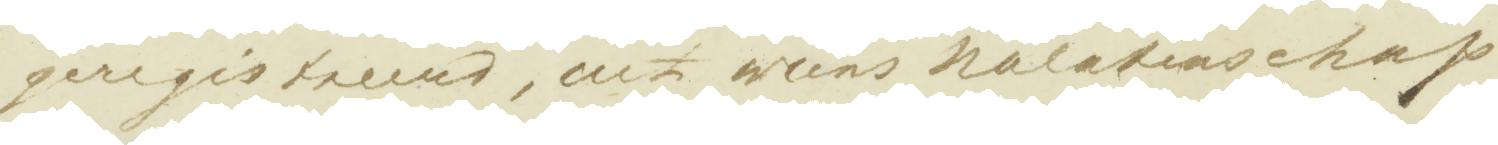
geregistreerd, uit wiens nalatenschap
